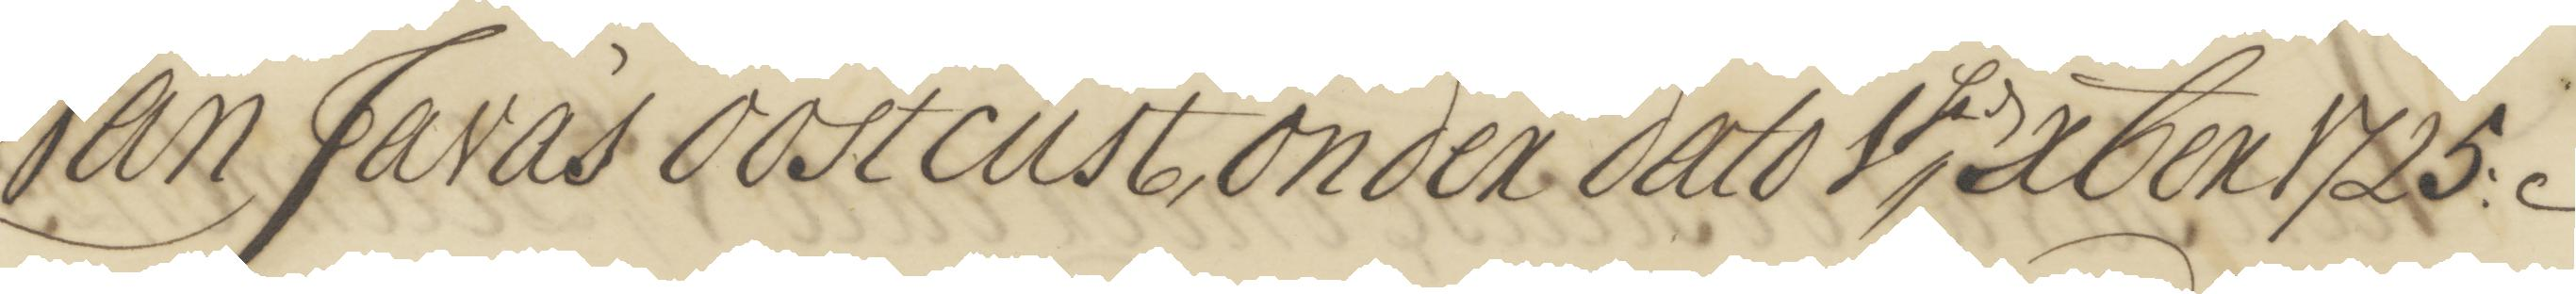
Van Java's oost cust, onder dato 1„sten xber 1725: —
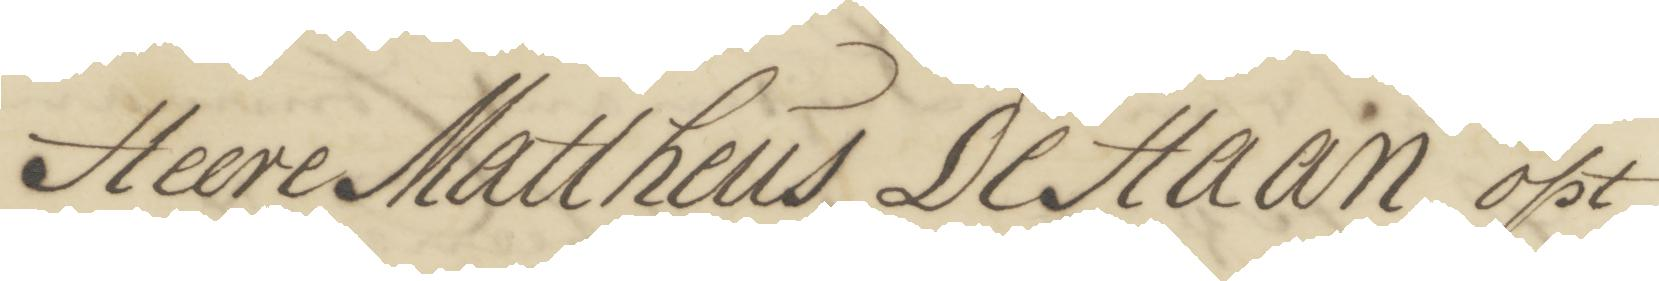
Heere Mattheus De Haan, opt
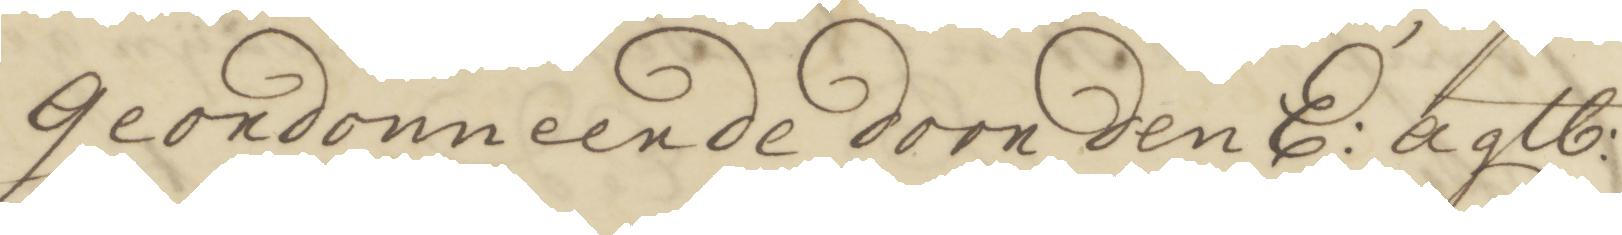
geordonneerde door den E: agtb.
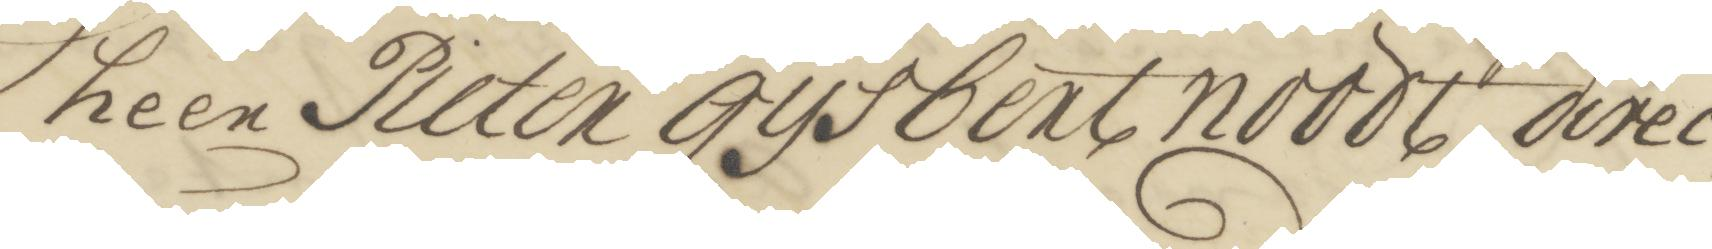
heer Pieter gijsbert noodt, direc
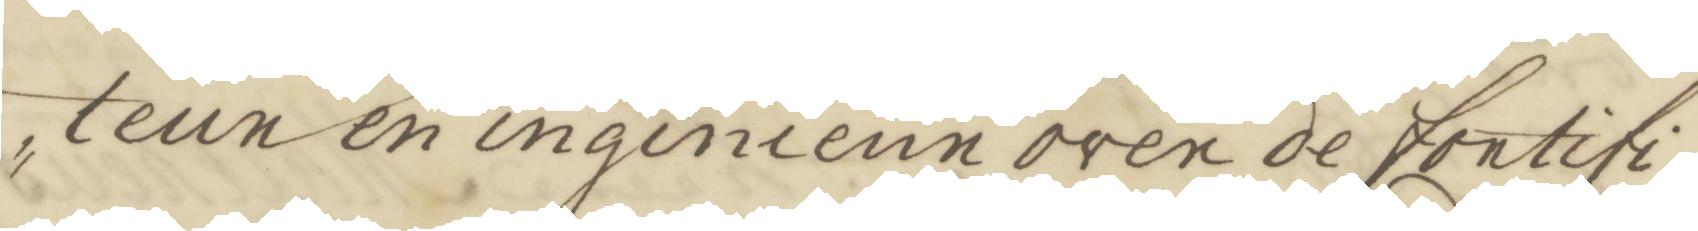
„teur en inginieur over de fortifi
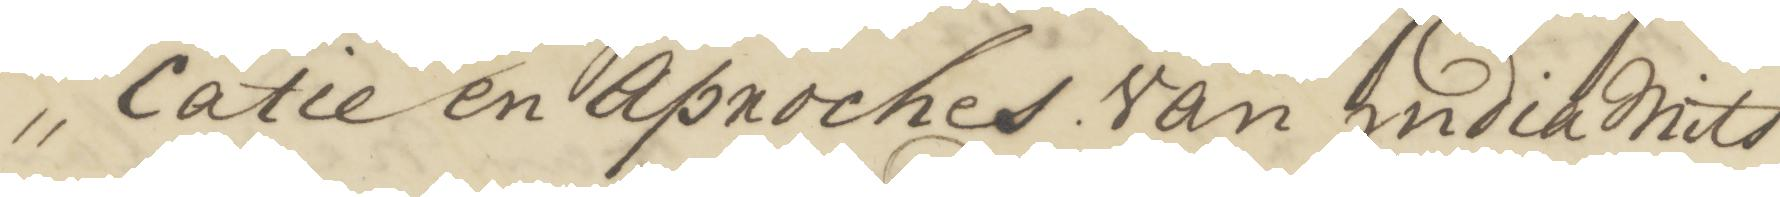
„catie en Aproches van jndia mits
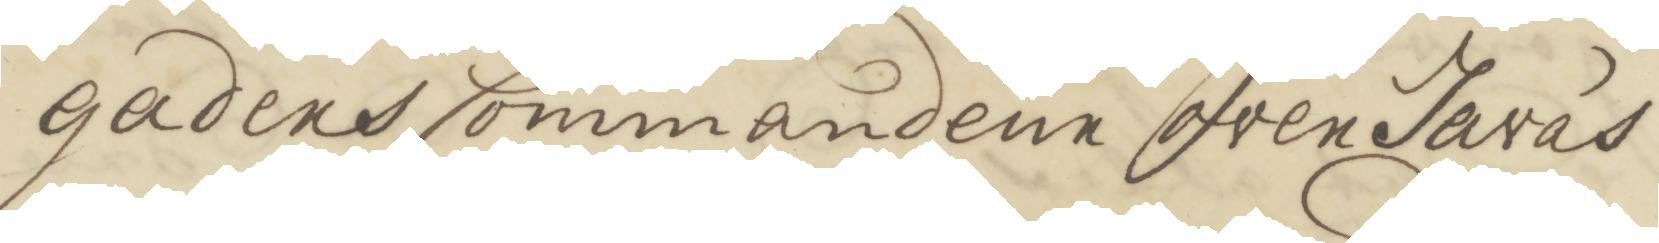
gaders Commandeur over Iava's
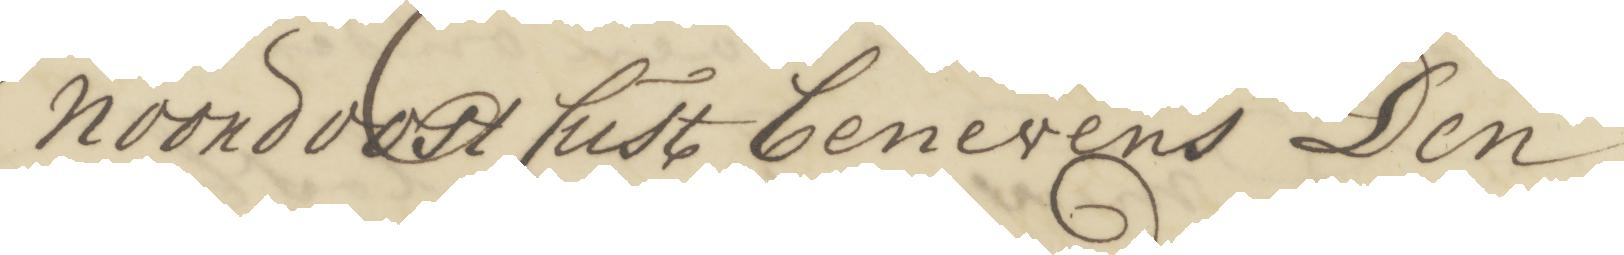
noord oost Cust benevens Den
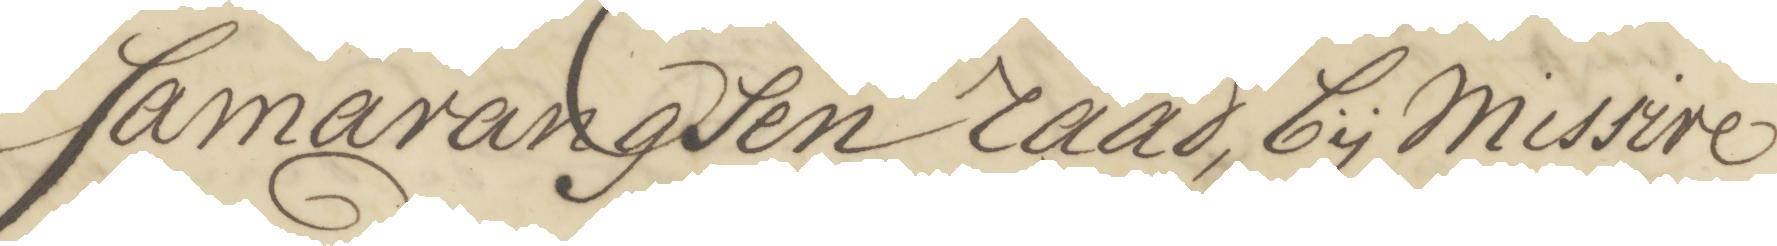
Samarangsen Raad, bij missive
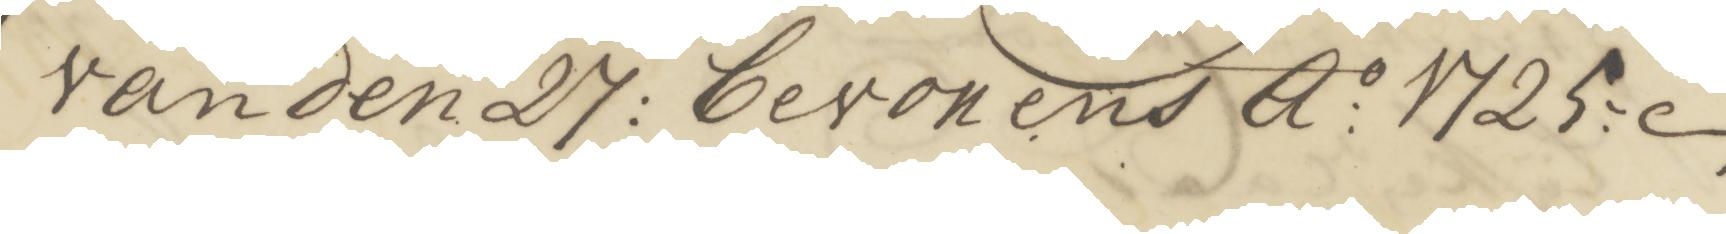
van den 27: bevorens A:o 1725: —
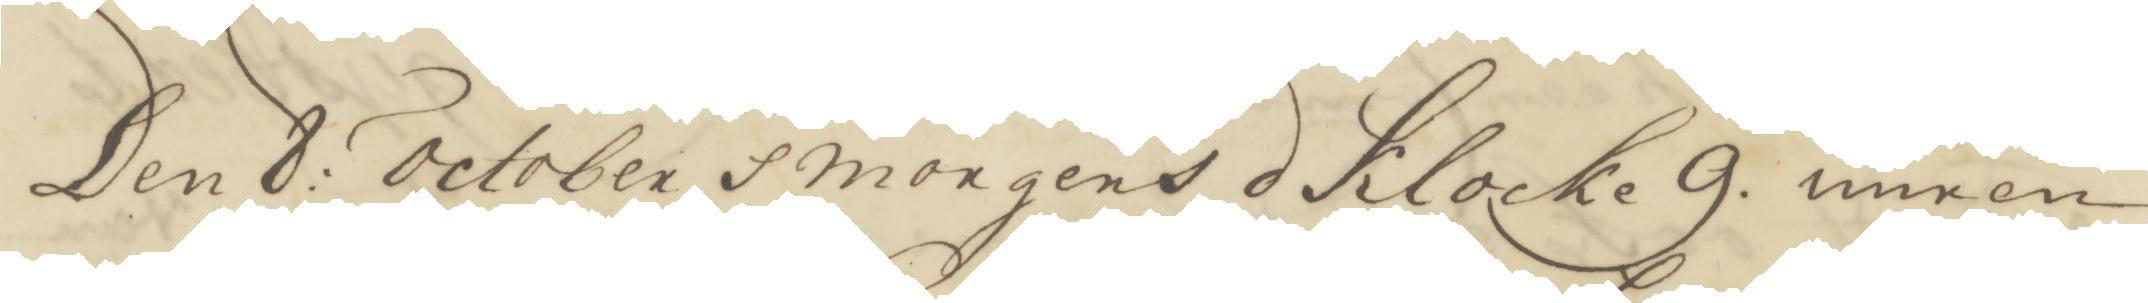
Den 8:' october 's morgens d klocke 9. uuren
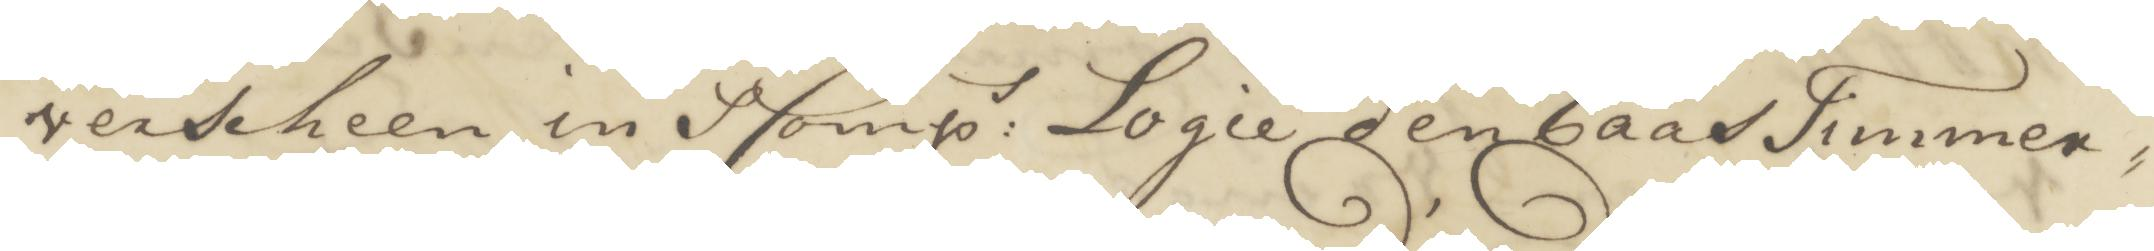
verscheen in s Comp:s Logie den baas Timmer„
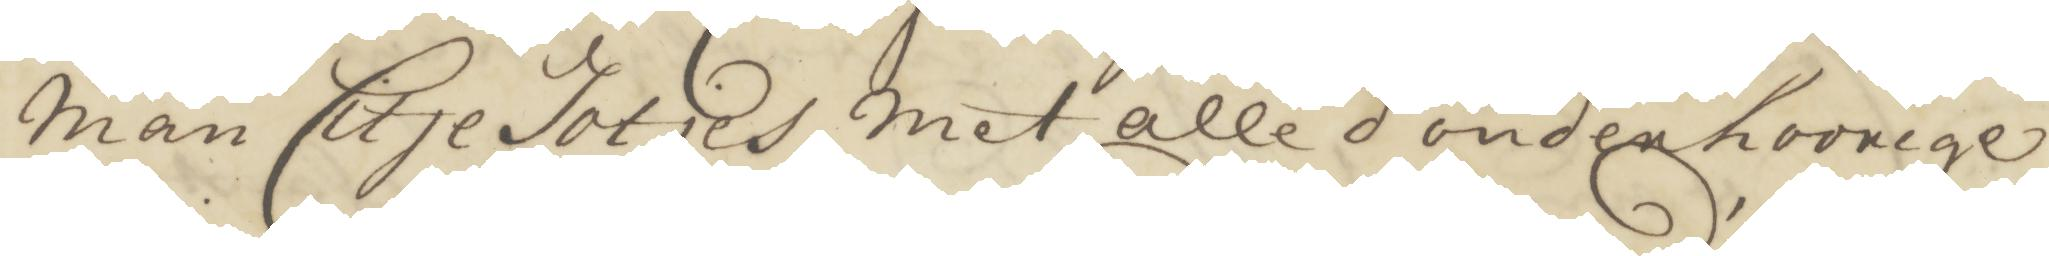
man Citje Iotjes met alle d'onderhoorige
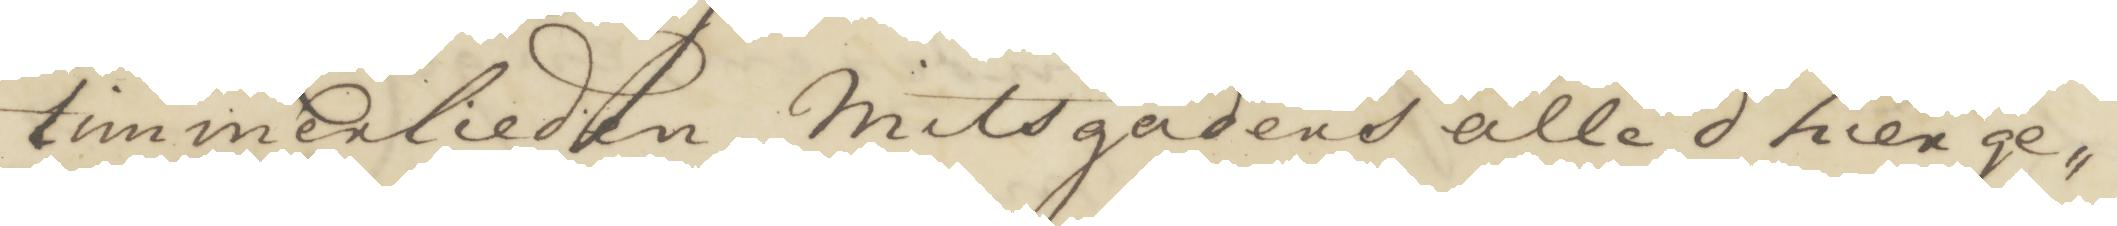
timmerlieden, mitsgaders alle d' hier ge„
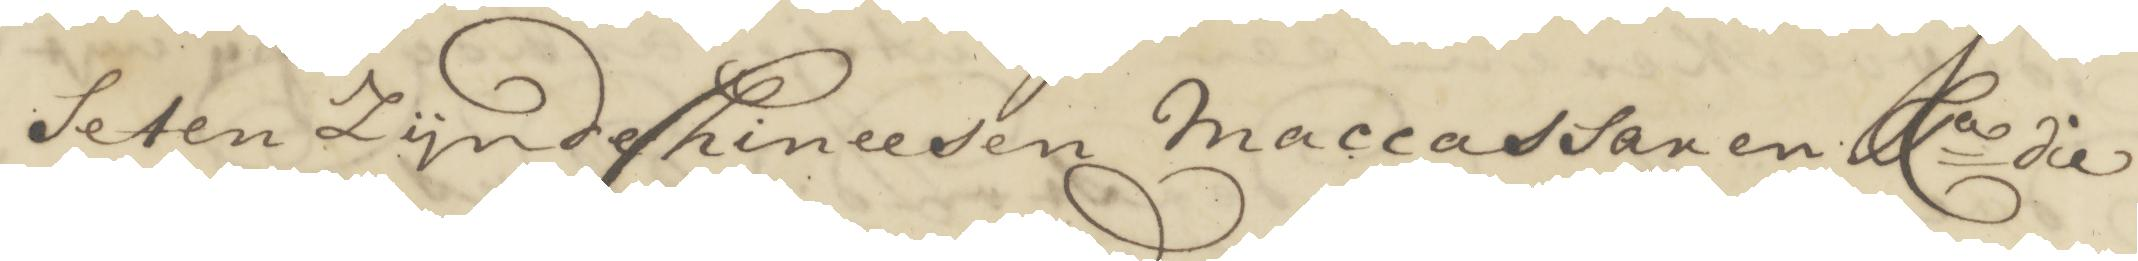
seten zijnde Chineesen Maccassar en &=a die
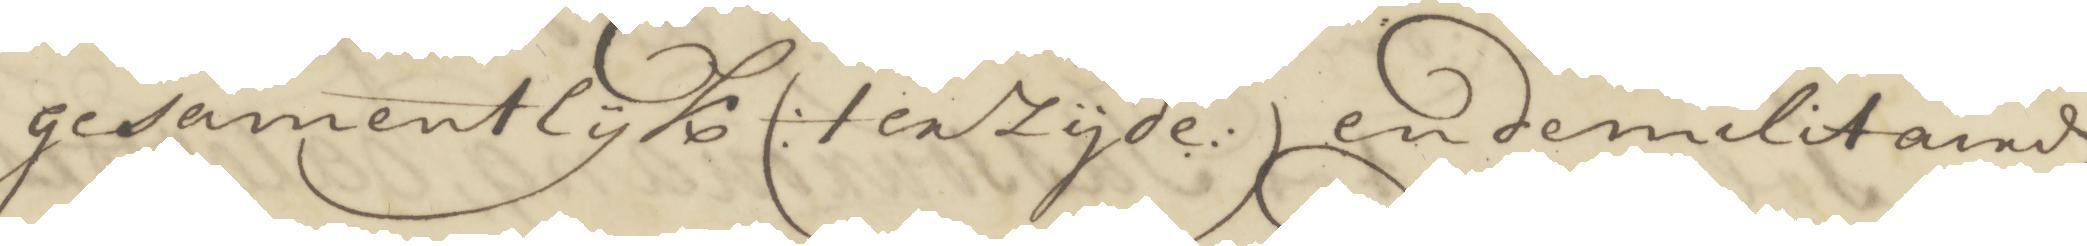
gesamentlijk (: ter zijde :) en de militairen
